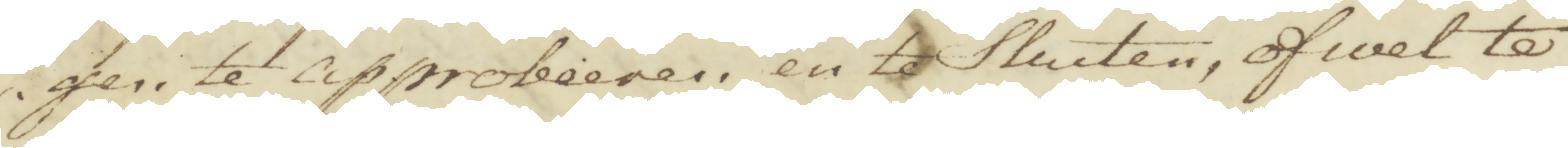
„gen te approbeeren en te sluiten, of wel te
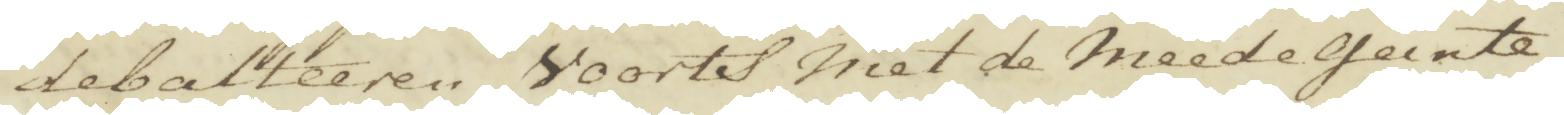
debatteeren, voorts met de meede geinte
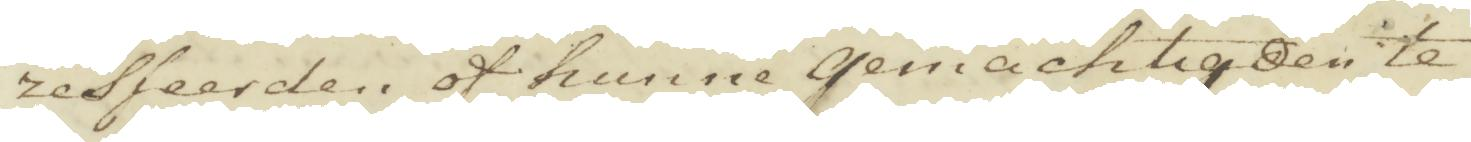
resseerden of hunne gemachtigden te
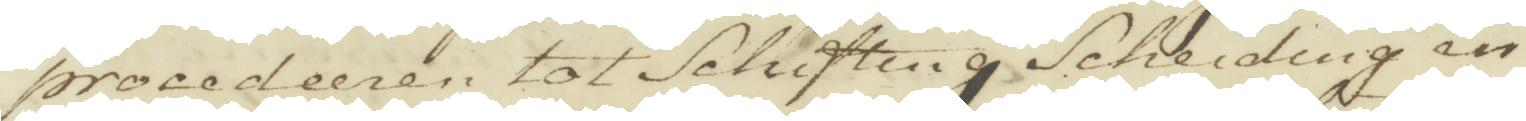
precedeeren tot schifting scheiding in
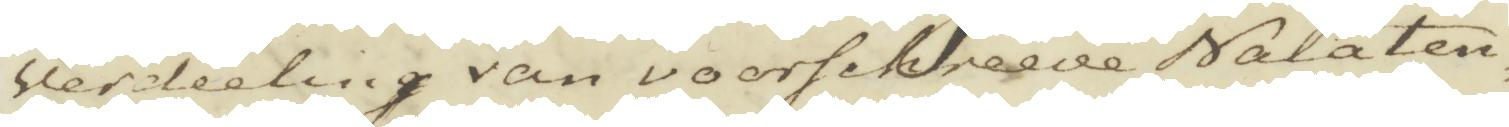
verdeeling van voorschreeve Nalaten„
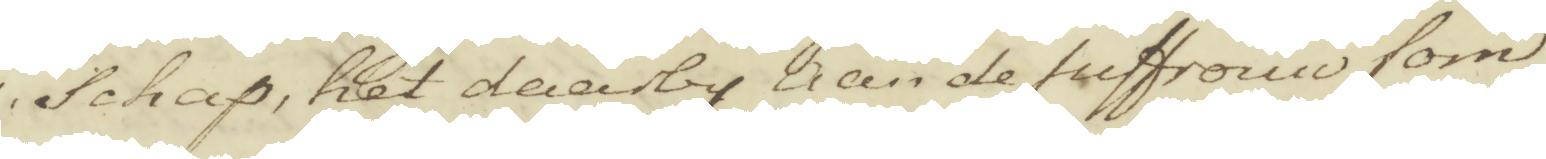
„schap, het daarby aan de juffrouw Com
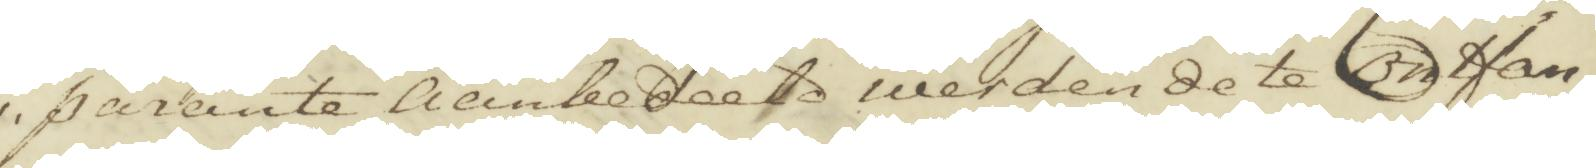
„parante Aanbedeeld werden de te ontfan
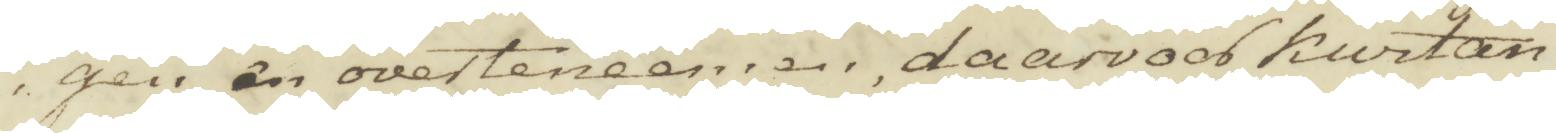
„gen en overteneemen daarvoor kwitan
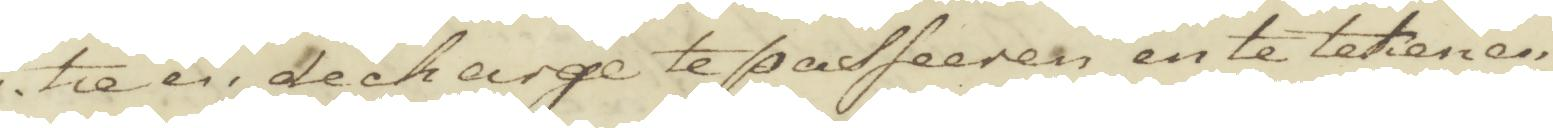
„tie en decharge te passeeren en te tekenen
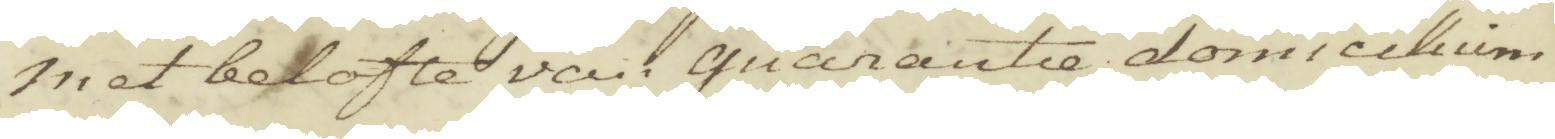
met belofte van guarantie domicilium
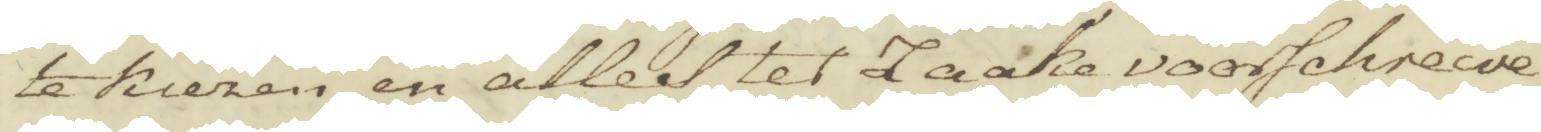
te kiezen, en alles ter zaake voorschreeve
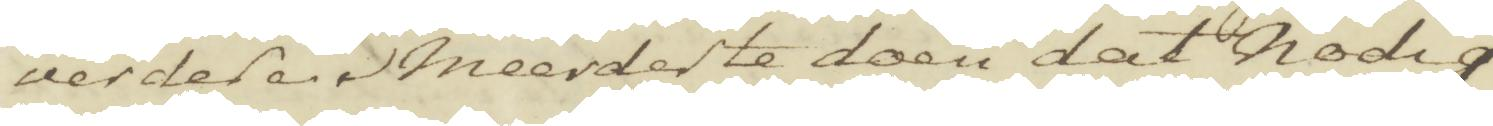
verder en meerder te doen dat nodig
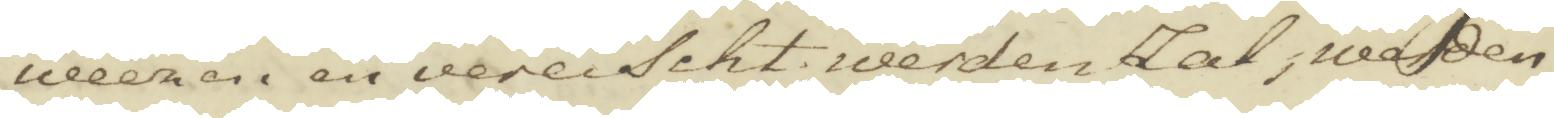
weezen en vereischt werden zal, werden
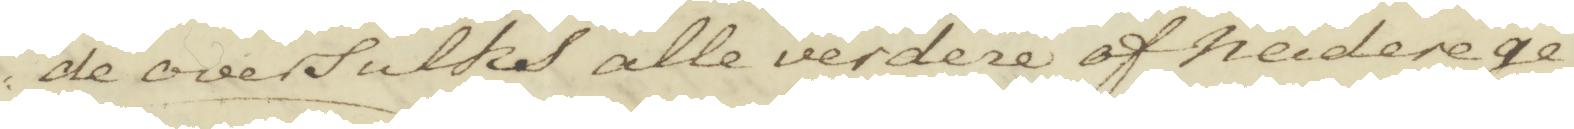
„de oversulks alle verdere of nadere ge
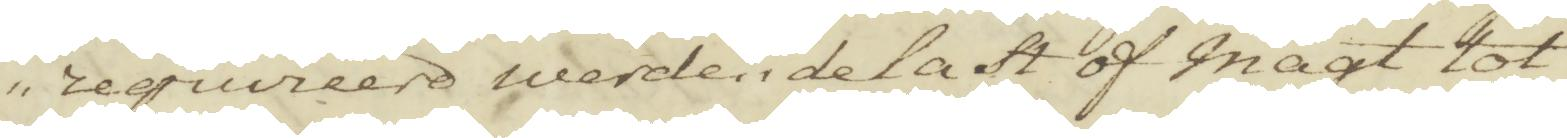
„requireerd werden de last of magt tot
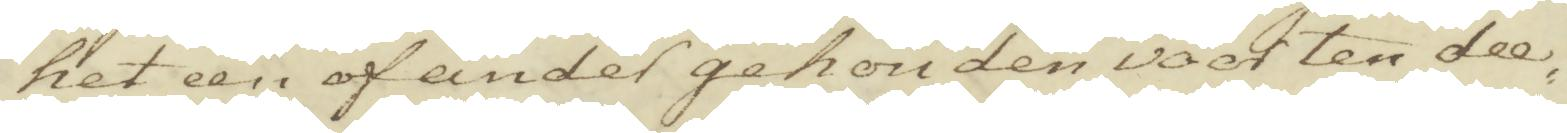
het een of ander gehouden voor ten dee„
